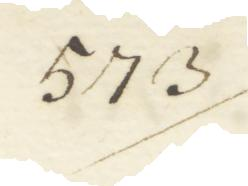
573
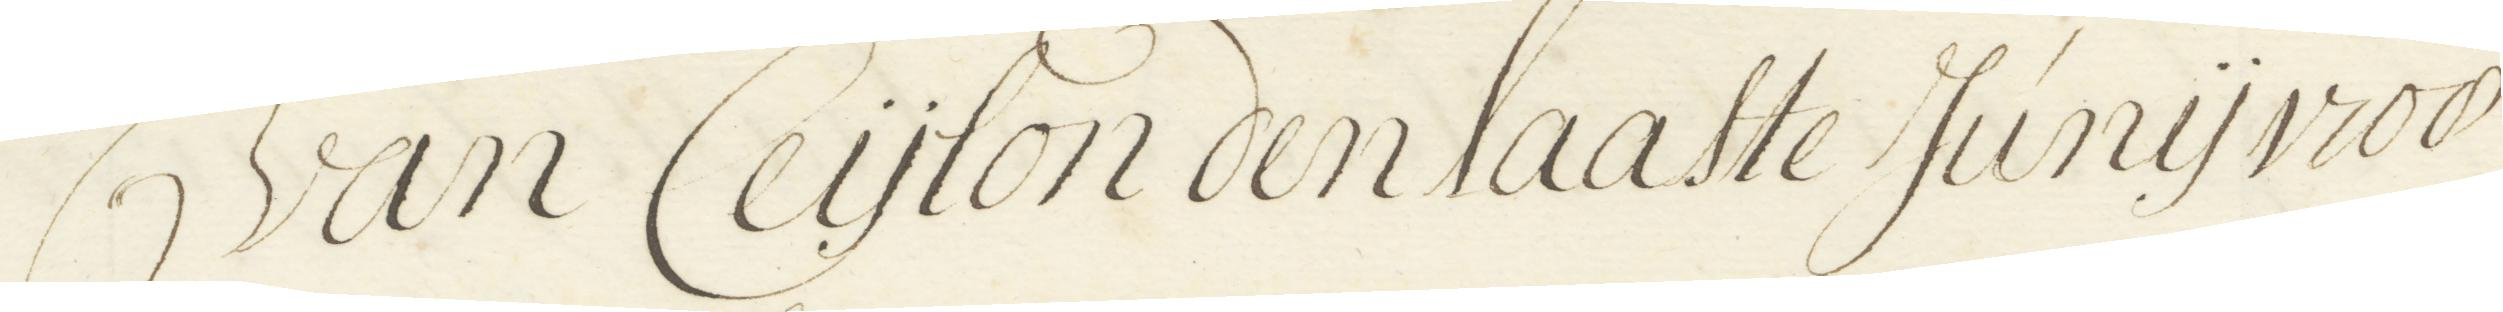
van Ceijlon den laaste Junij 1708
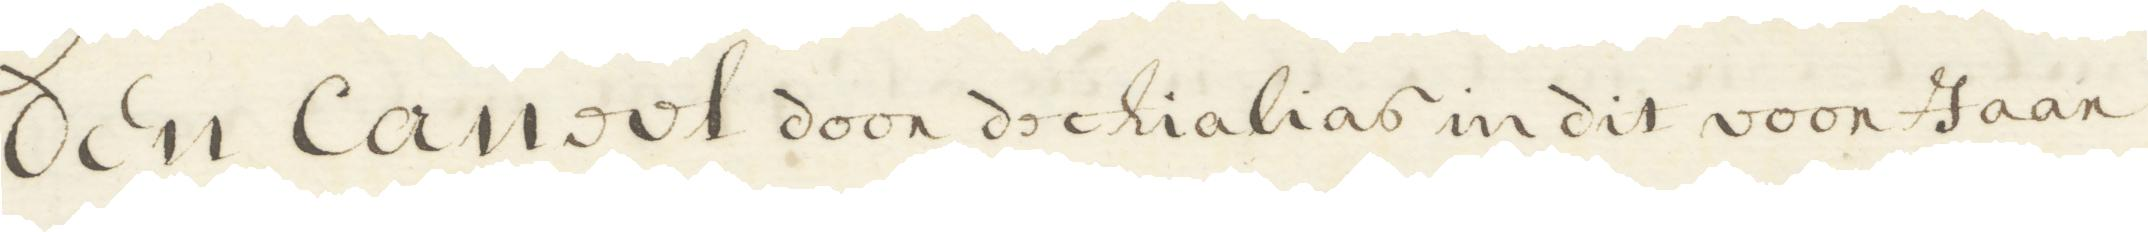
den Caneel door dechialias in dit voor Jaar
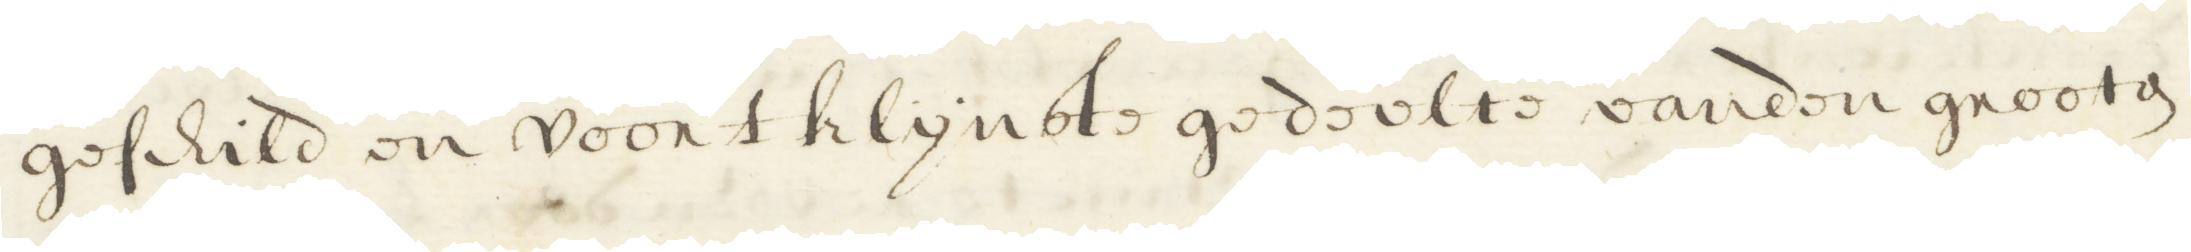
geschild en voor t klijnste gedeelte vanden grooten
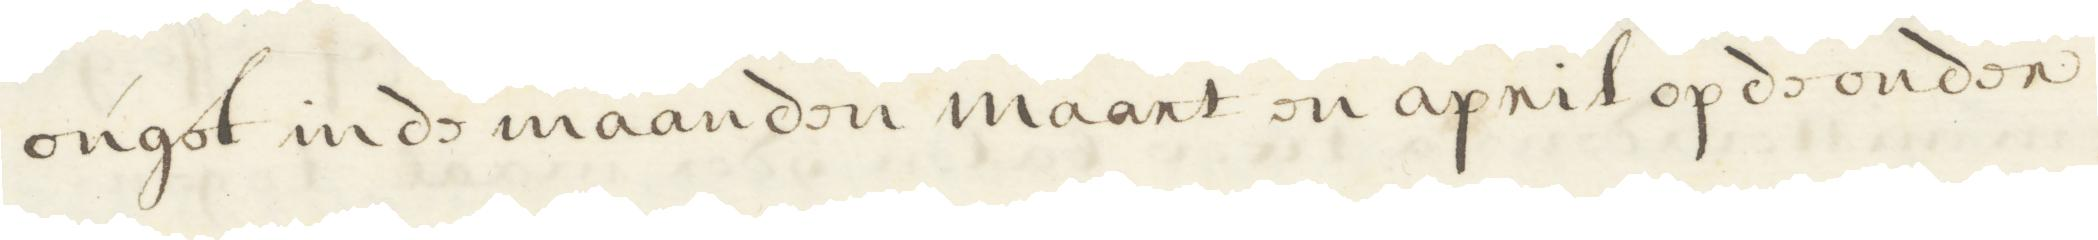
ougst in de maanden maart en april op de onder
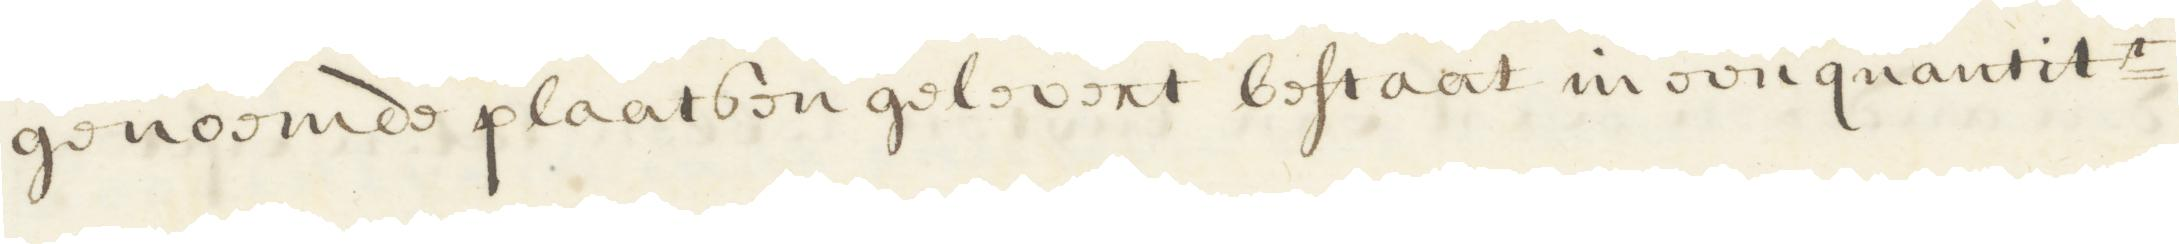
genoemde plaatsen gelevert bestaat in een quantit=t
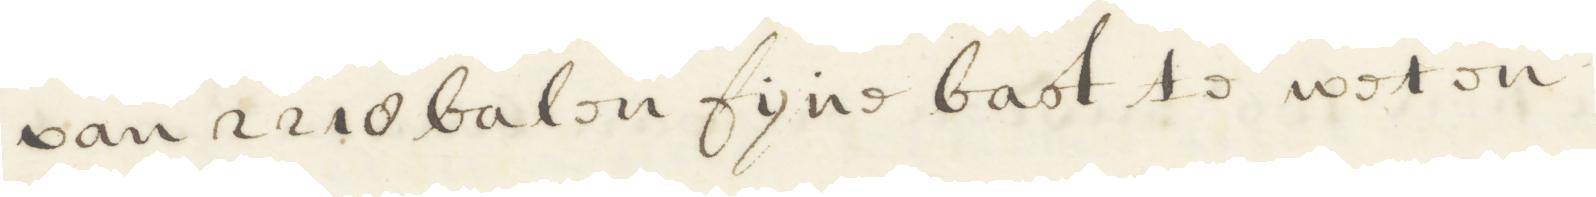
van 2218 balen fijne bast te weten
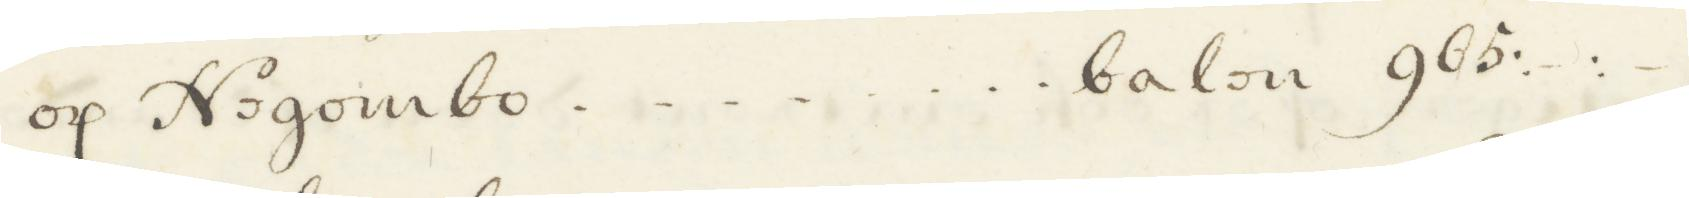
op Negombo - - - - - - - - balen 965:—:—
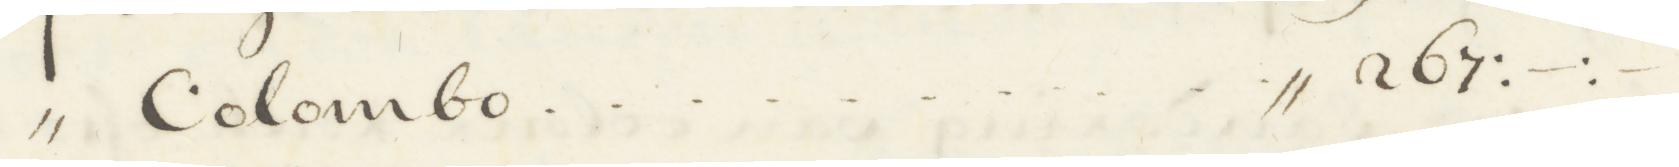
„ Colombo - - - - - - - - - - „ 267:—:—
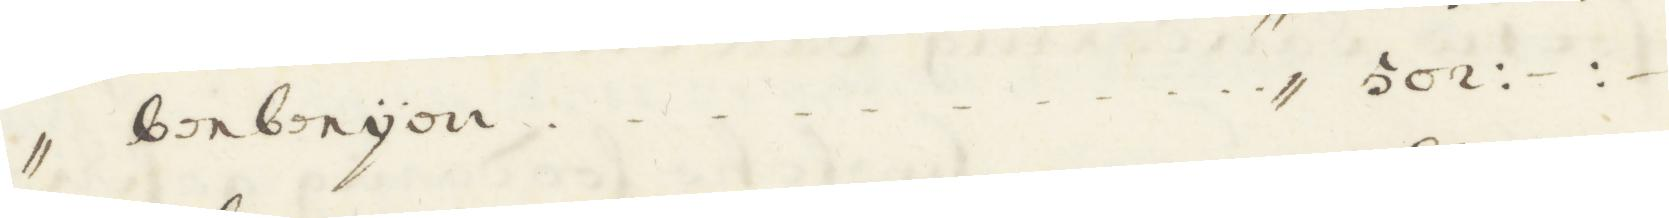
„ berberijen - - - - - - - - - - - „ 502:—:—
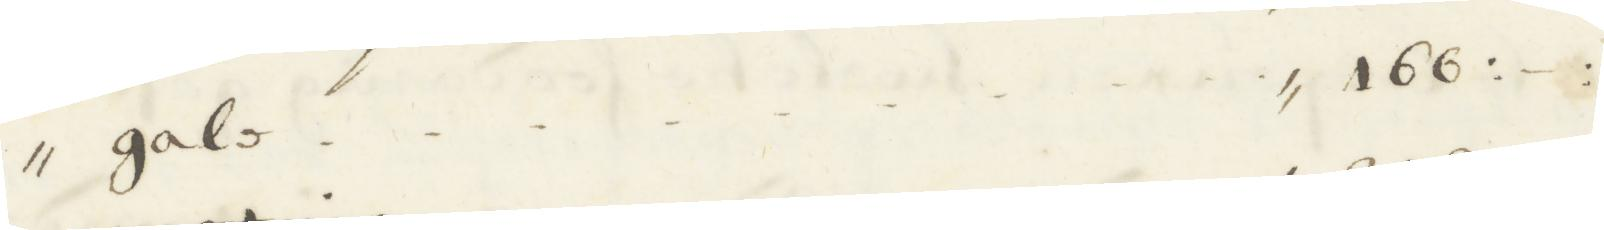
„ gale - - - - - - - - - - „ 166:—:
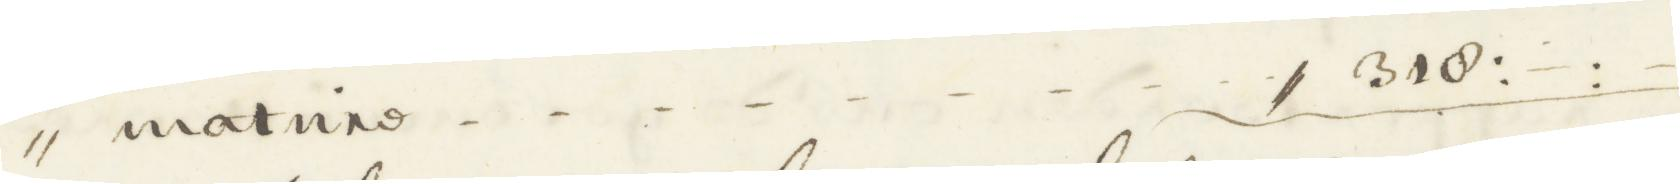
„ mature - - - - - - - - - - „ 318:—:—
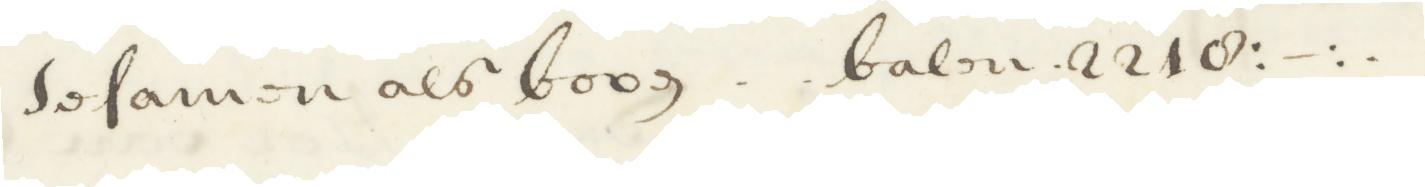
te samen als boven - - balen 2218:—:-
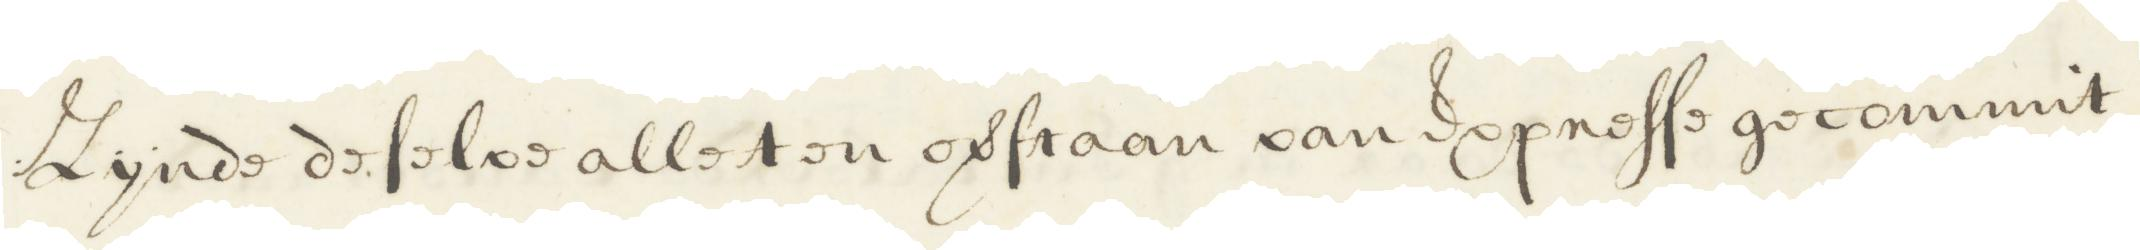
Zijnde deselve alle ten overstaan van Expresse gecommit
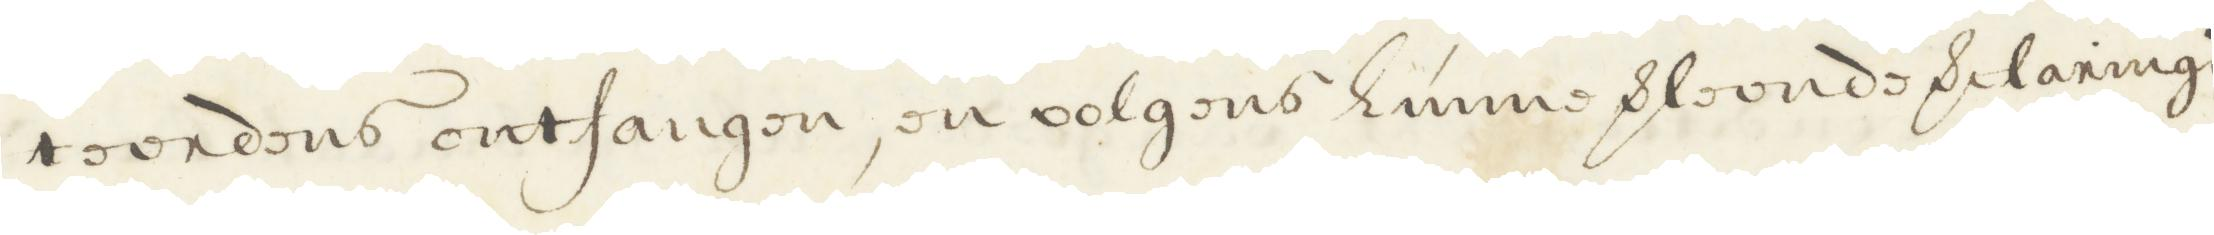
teerdens ontfangen, en volgens hunne verleende verclaring
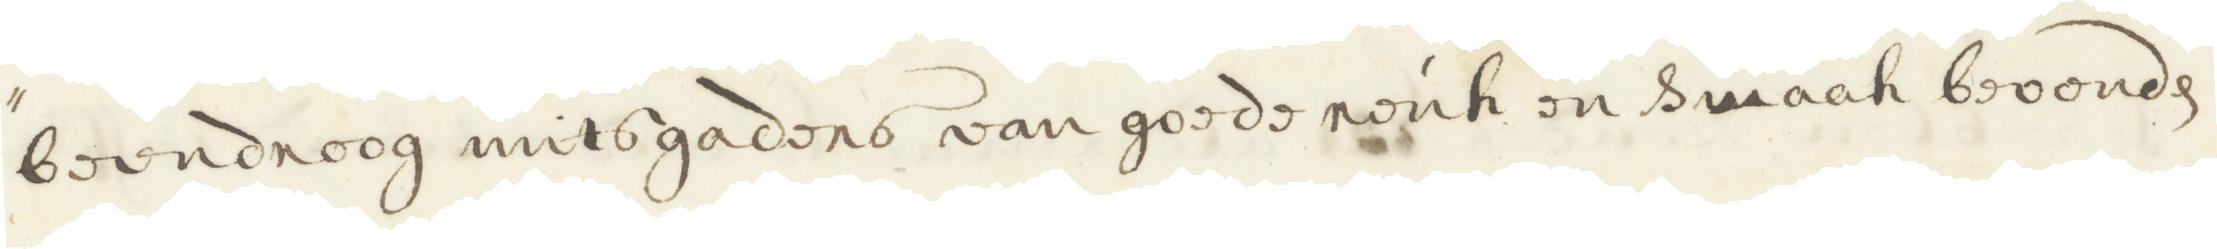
beendroog mitsgaders van goede reuk en smaak bevonden
